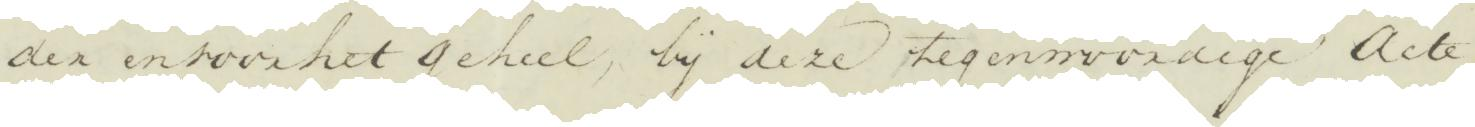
der en voor het geheel, bij deze tegenwoordige Acte
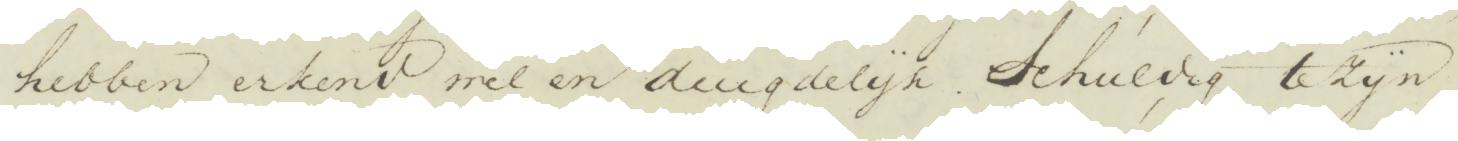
hebben erkend wel en deugdelijk Schuldig te zijn
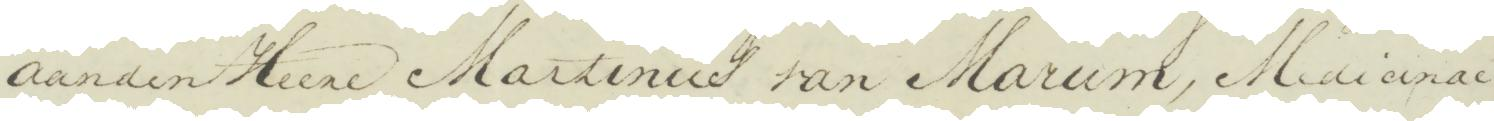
aan den Heere Martinus van Marum, Medicinae
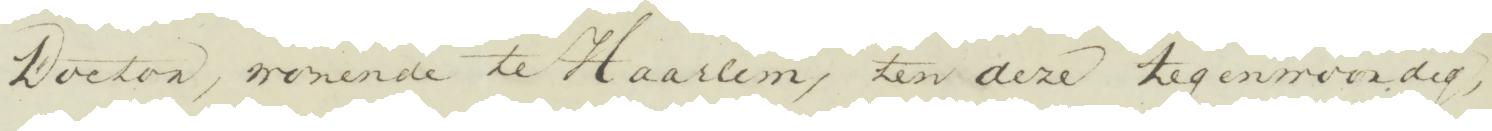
Doctor, wonende te Haarlem, ten deze tegenwoordig,
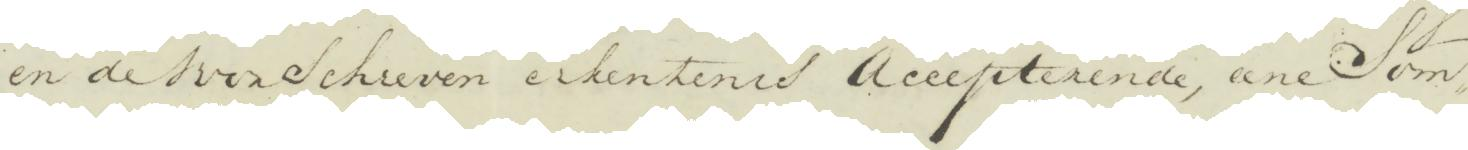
en de voorschreven erkentenis Accepeterende, eene Som„
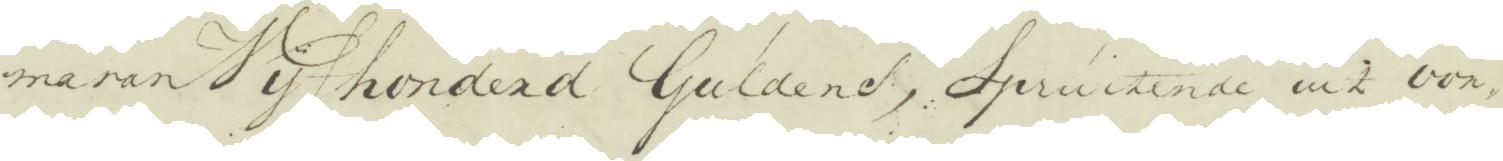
ma van Vijfhonderd Guldens, Spruitende uit oor„
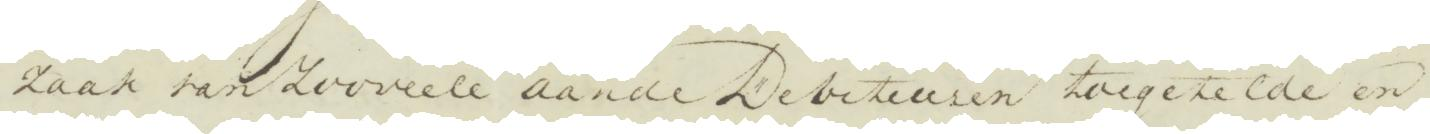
zaak van Zooveele aan de Debiteuren toegetelde en
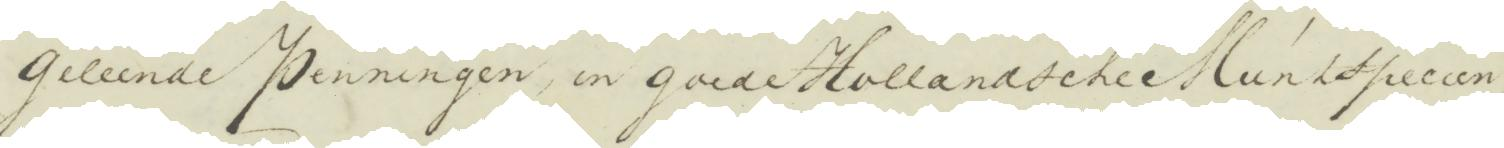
geleende Penningen, in goede Hollandsche Muntspecien
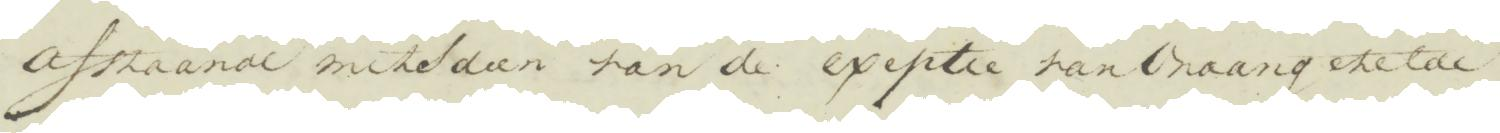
afstaande mitsdien van de exeptie van Onaangetelde
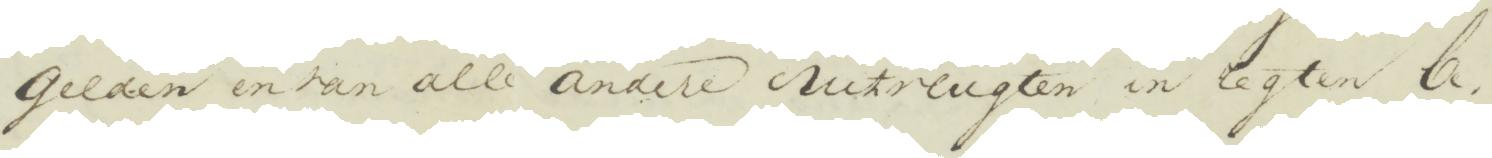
gelden en van alle andere uitvlugten in regten be,
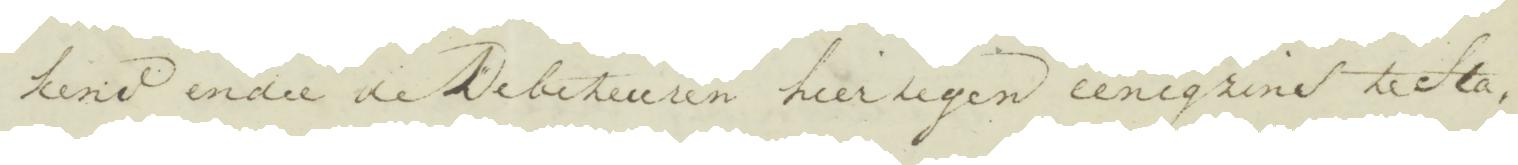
kend en die de Debiteuren hier tegen eenigzins te Sta,
